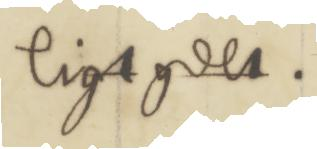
ligt gelt.
